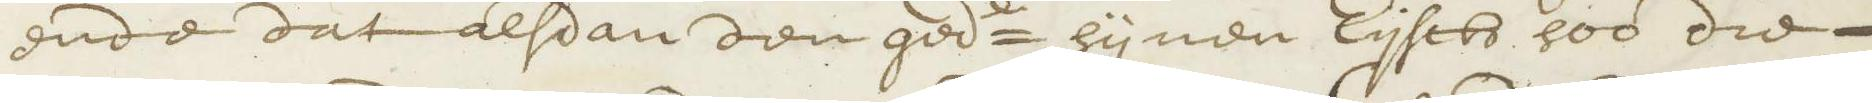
ende dat alsdan den ged=e sijnen Eijsch soo die
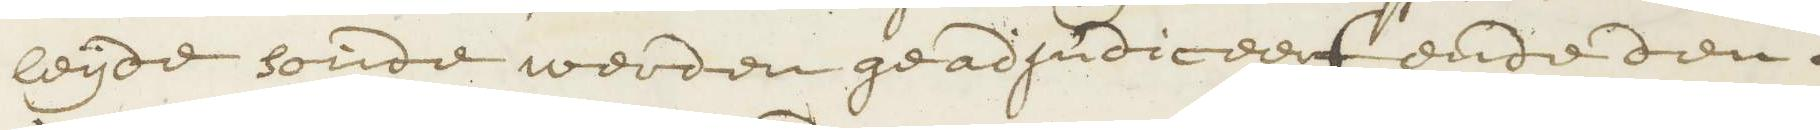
leijde soude werden geadjudiceert ende den
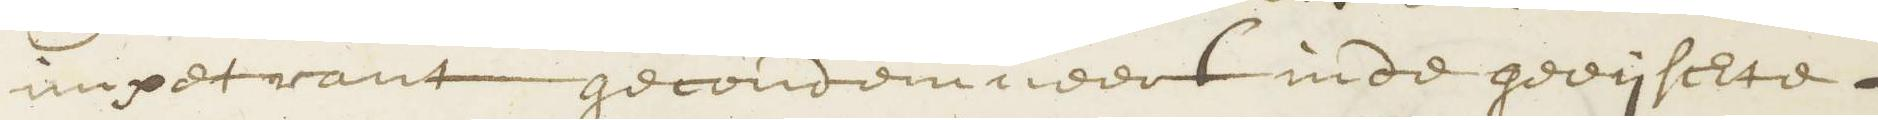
impetrant gecondemneert in de geeijschte
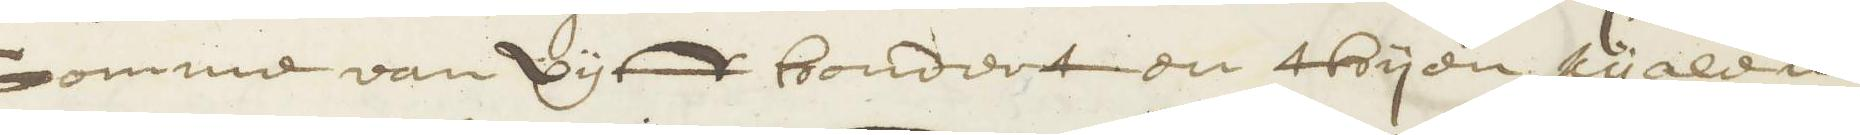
somme van vijff hondert en thijen rijalen
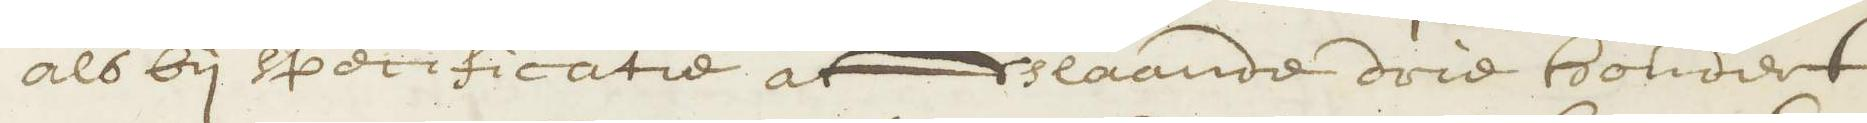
als bij specificatie affslaande drie hondert
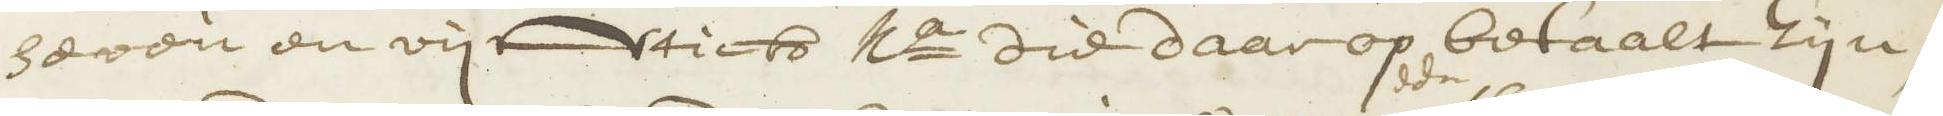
seven en vijfftich r=a die daar op betaalt zijn,
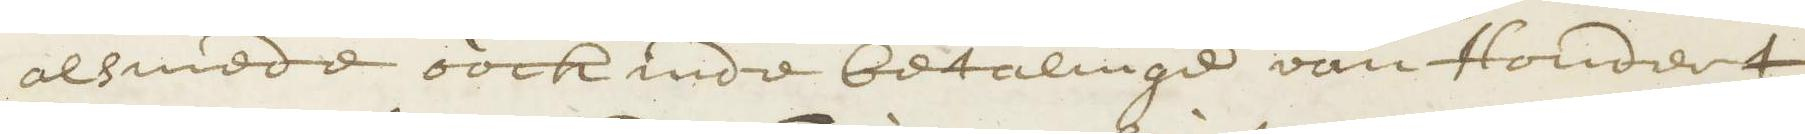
als mede oock inde betalinge van Hondert
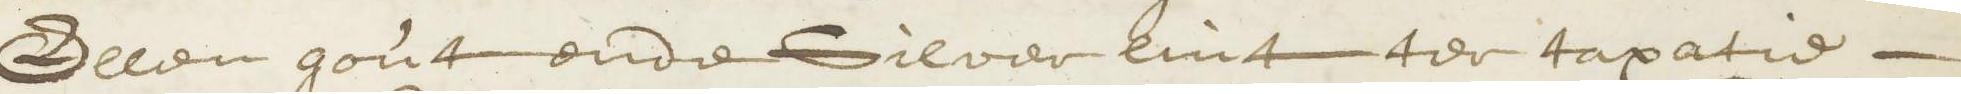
Ellen gout ende silver lint ter taxatie
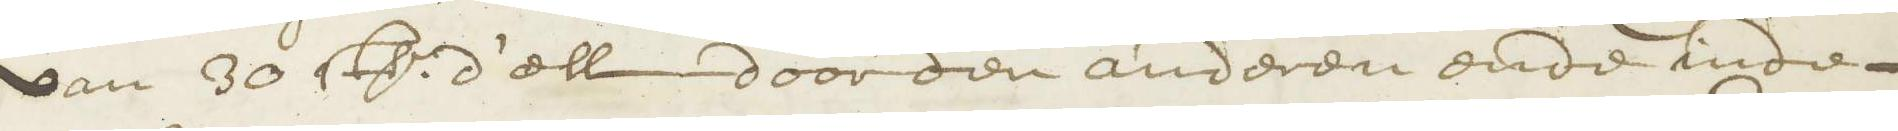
van 30 stver:s d’ell door den anderen ende inde
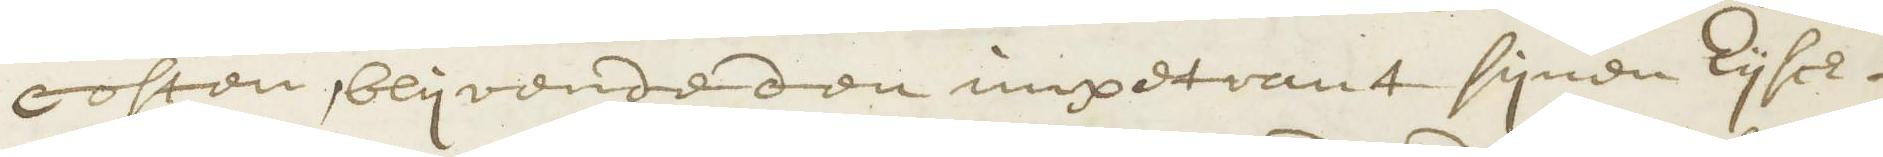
costen, blijvende den impetrant sijnen Eijsch
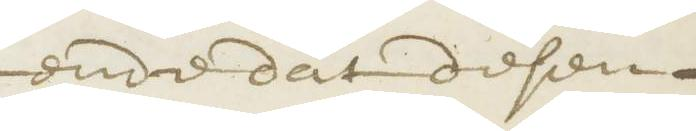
ende dat desen
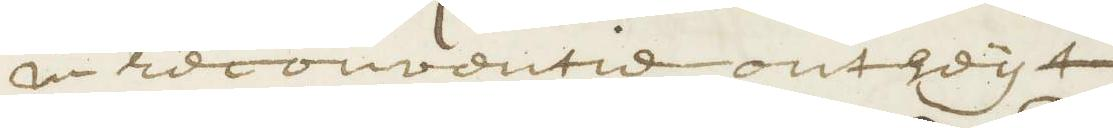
in reconventie ontheijt
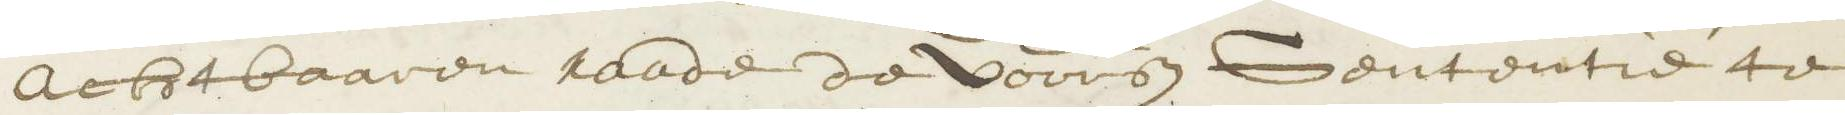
achtbaaren raade de voorsz sententie te
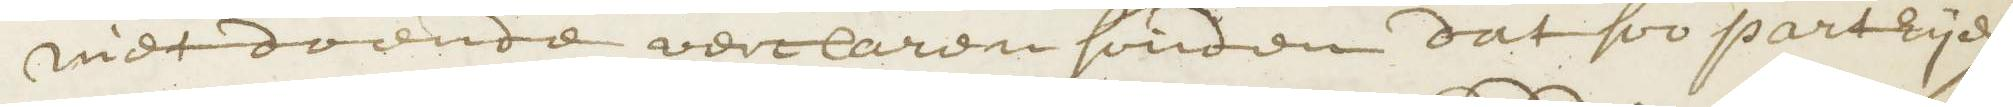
niet doende verclaren souden dat soo parthijen
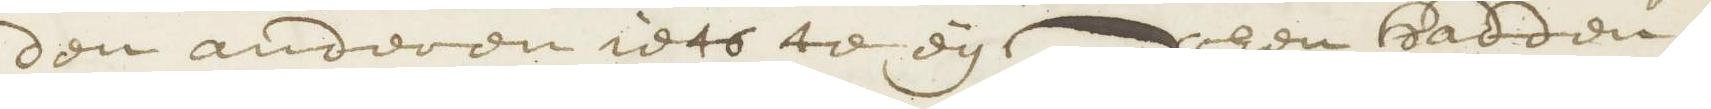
den anderen iets te eijsschen hadden
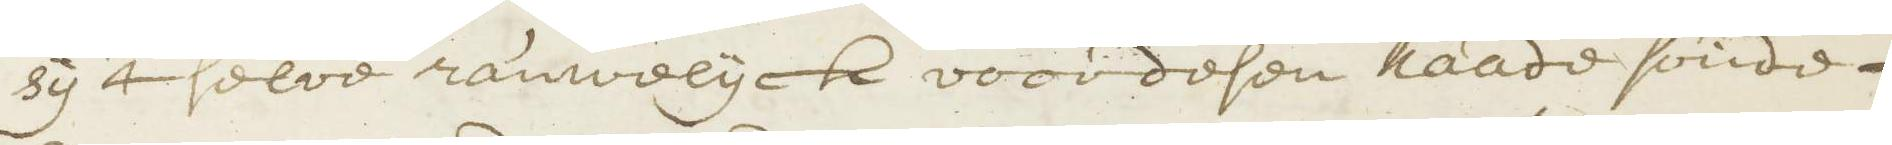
sij 't selve rauwelijck voor desen raade soude
